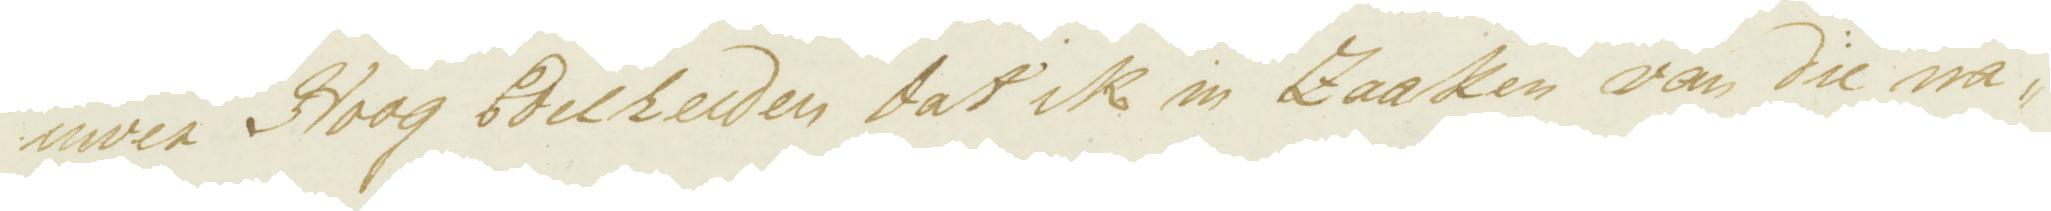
uwer Hoog Edelheeden dat ik in zaaken van die na„
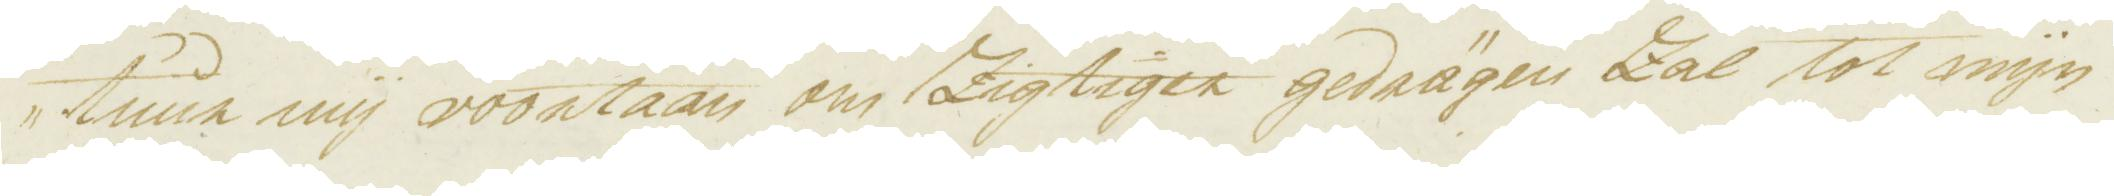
„tuur mij voortaan om zigtiger gedrägen zal tot mijn
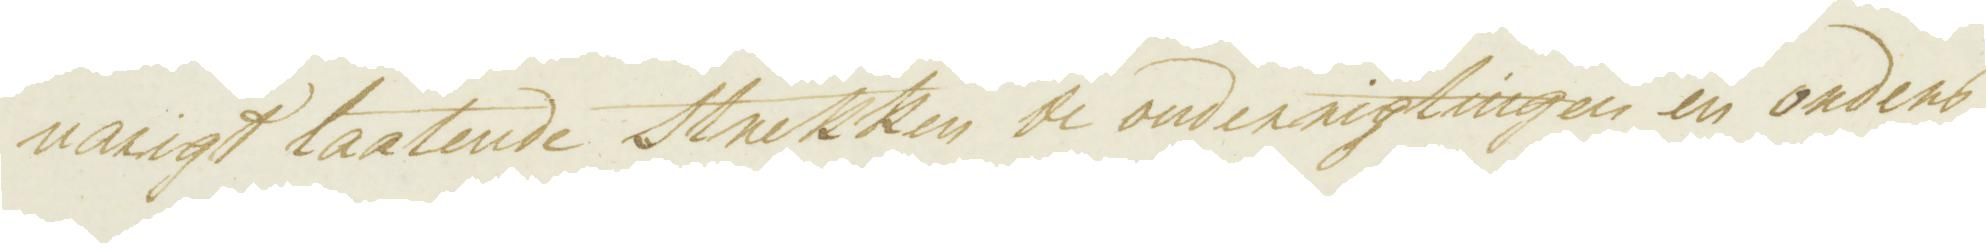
narigt laatende strekken de onderrigtingen en orders
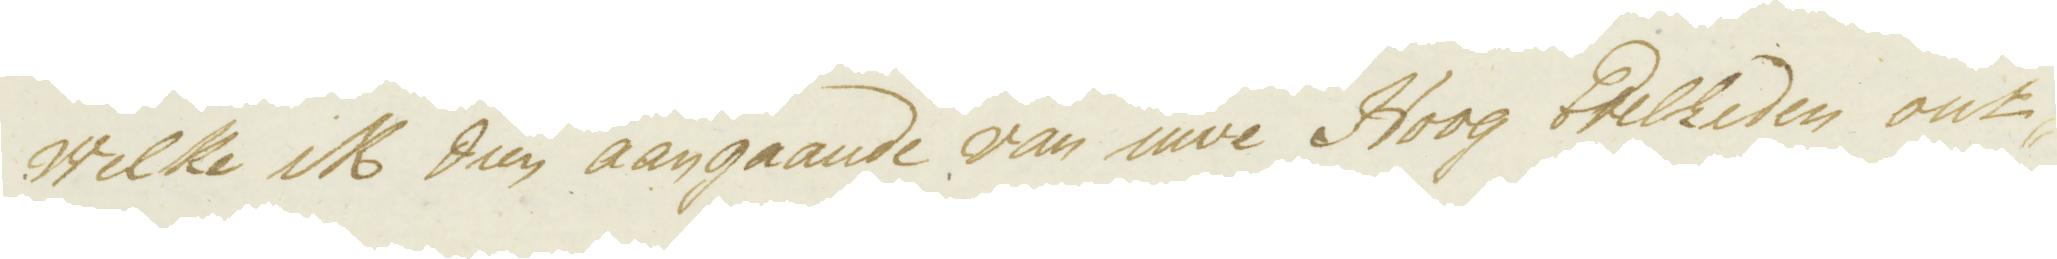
welke ik dien aangaande van uwe Hoog Edelheden ont„
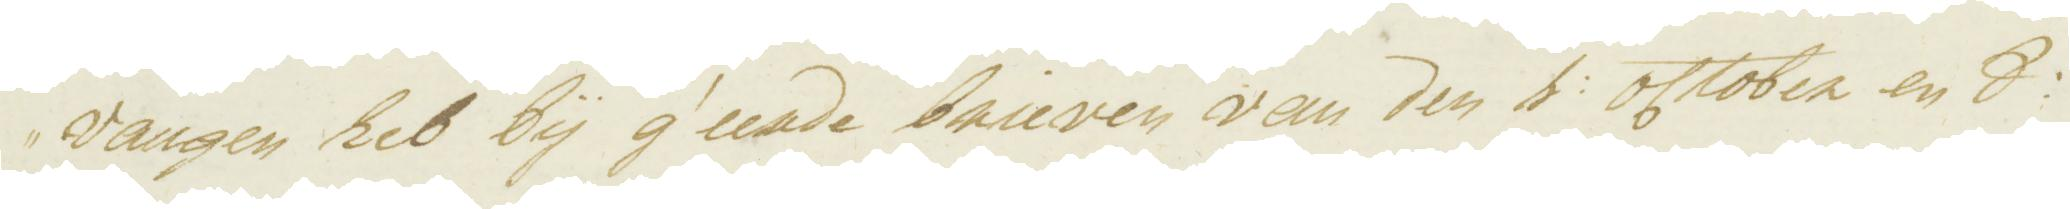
„vangen heb bij g’eerde brieven van den 1: october en 8:
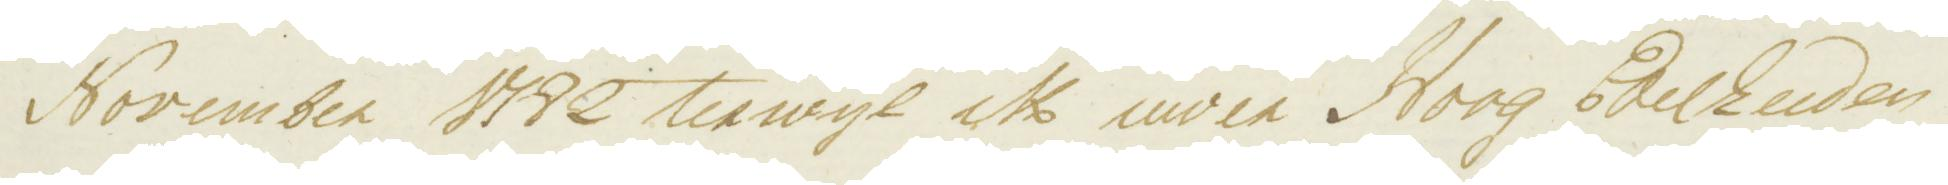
November 1782 terwijl ik uwer Hoog Edelheeden
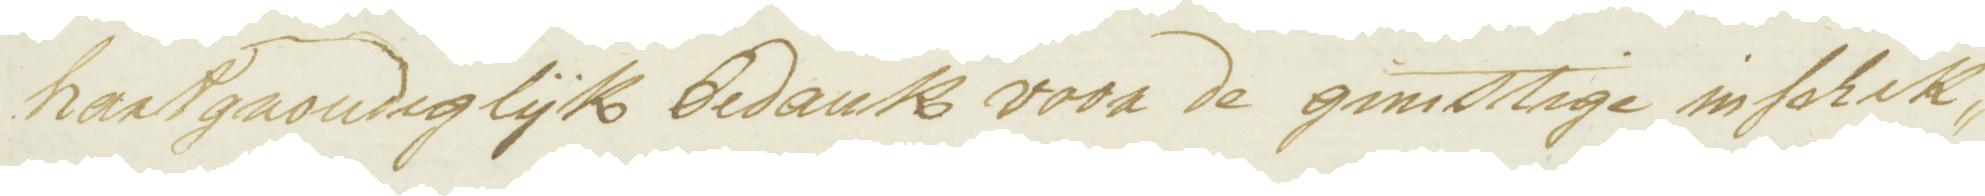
hartgrondiglijk bedank voor de gunstige inschik„
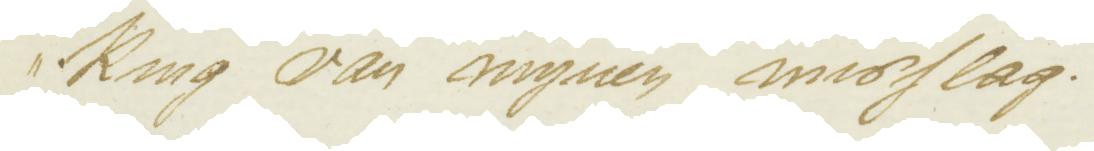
„king van mijnen misslag.
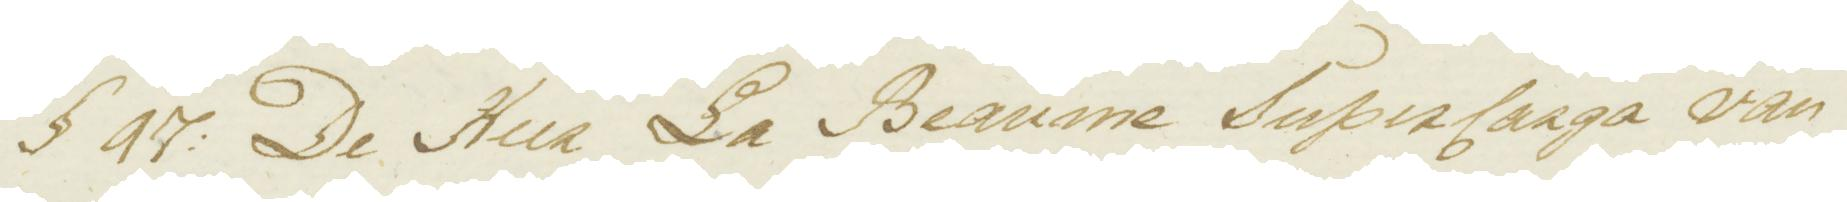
§ 47: De Heer La Beaume supercarga van
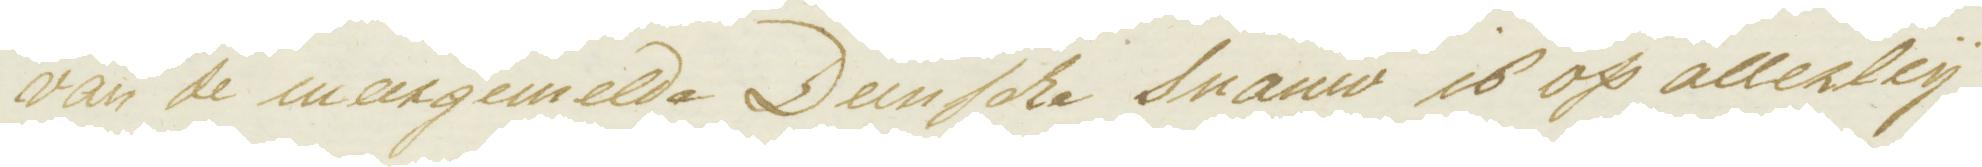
van de meergemelde Deensche snauw is op allerleij
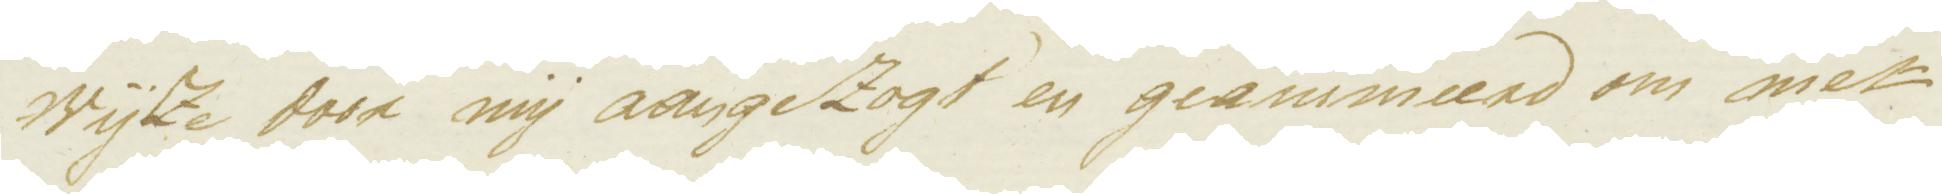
wijze door mij aangezogt en geanimeerd om met
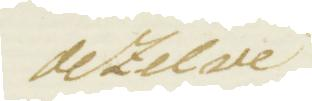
dezelve
